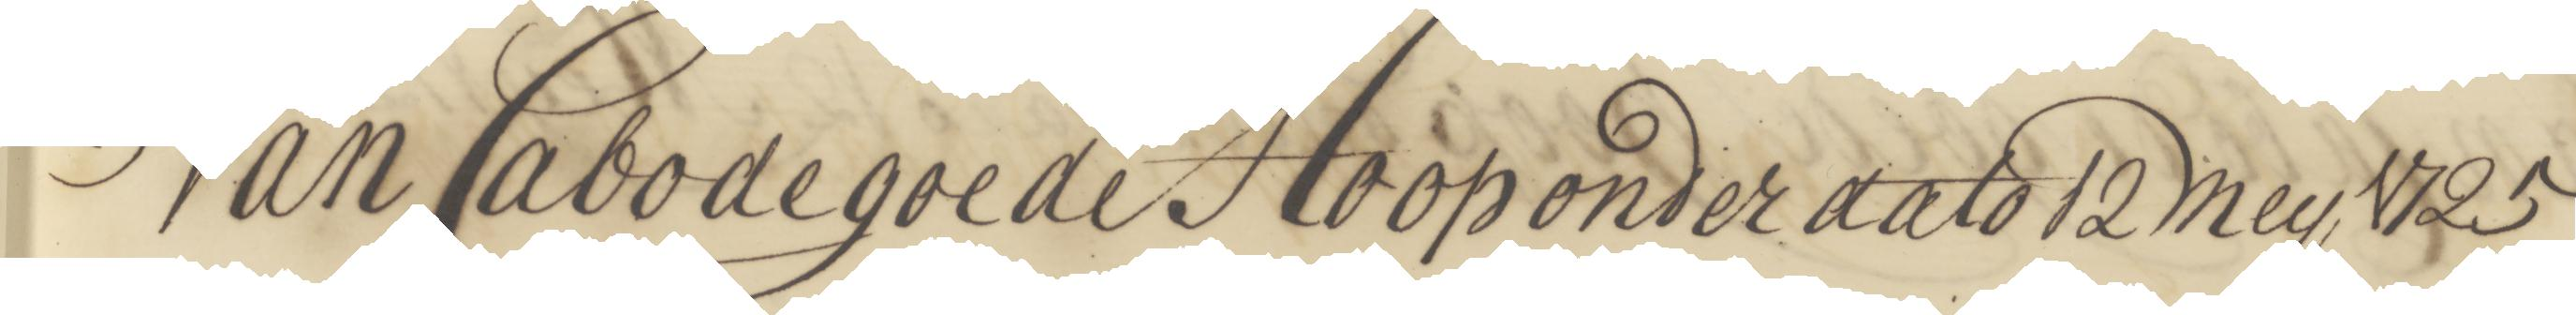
Van Cabo de goede Hoop onder dato 12 mey 1725
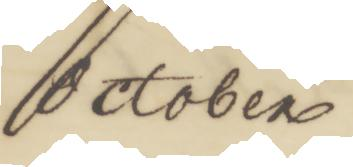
october
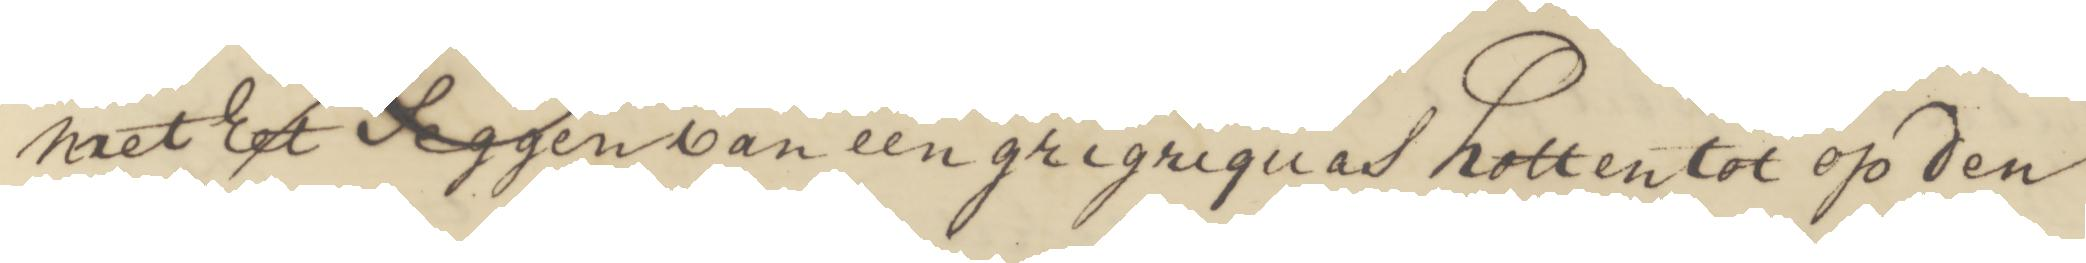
niet het seggen van een grigriquas hottentot op den
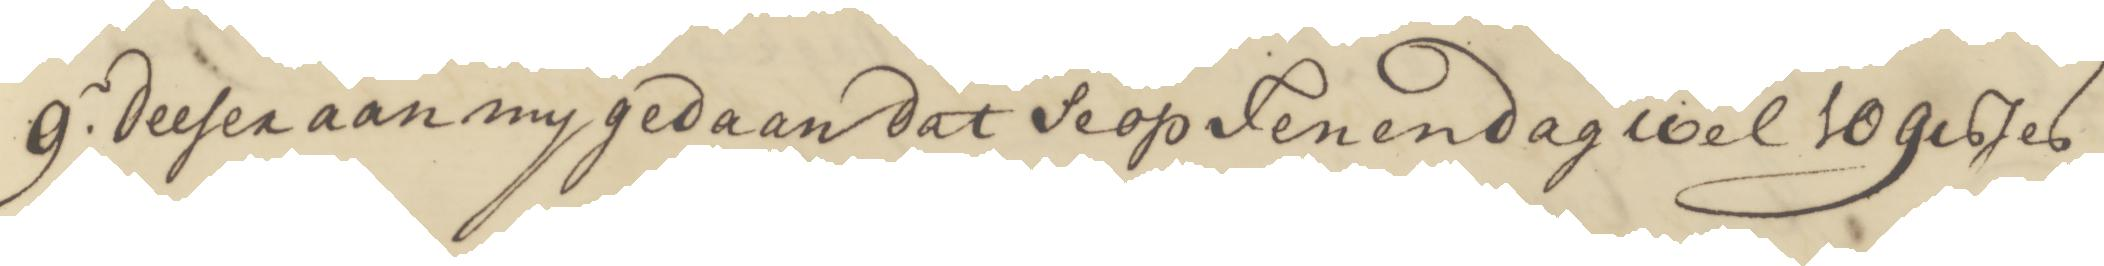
9. deeser aan my gedaan dat se op Eenen dag wel 10 gisjes
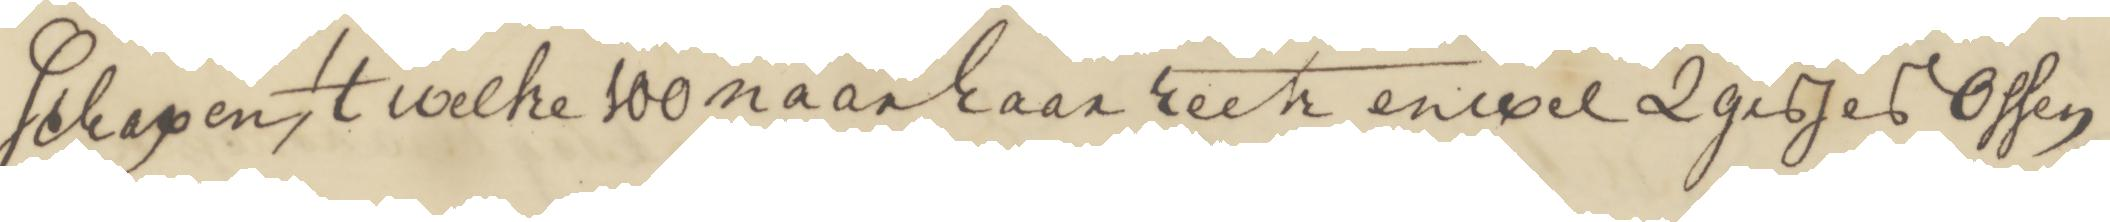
schapen, ’t welke 100 naar haar reek en wel 2 gisjes Ossen
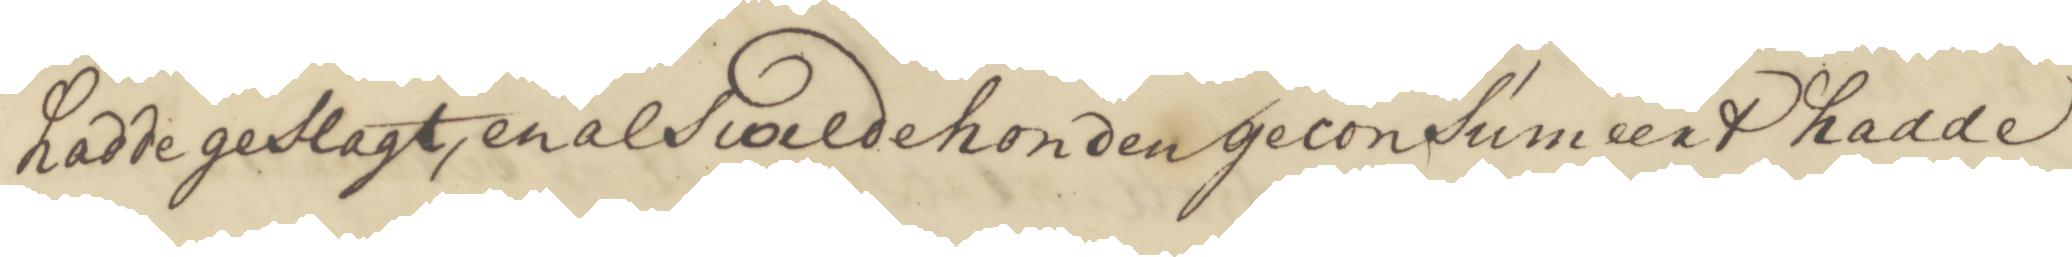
hadde geslagt, en als wilde honden geconsumeert hadde
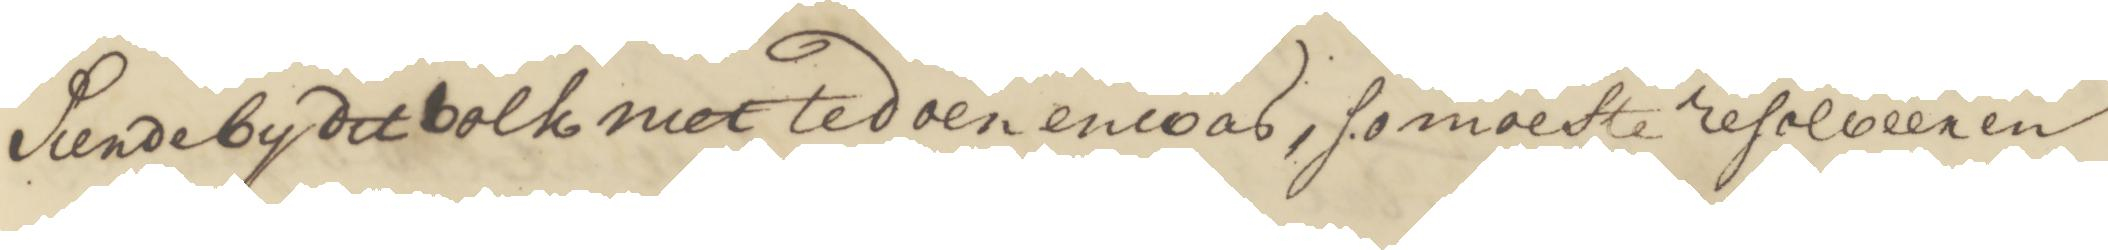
siende by dit volk niet te doen en was, so moeste resolveeren
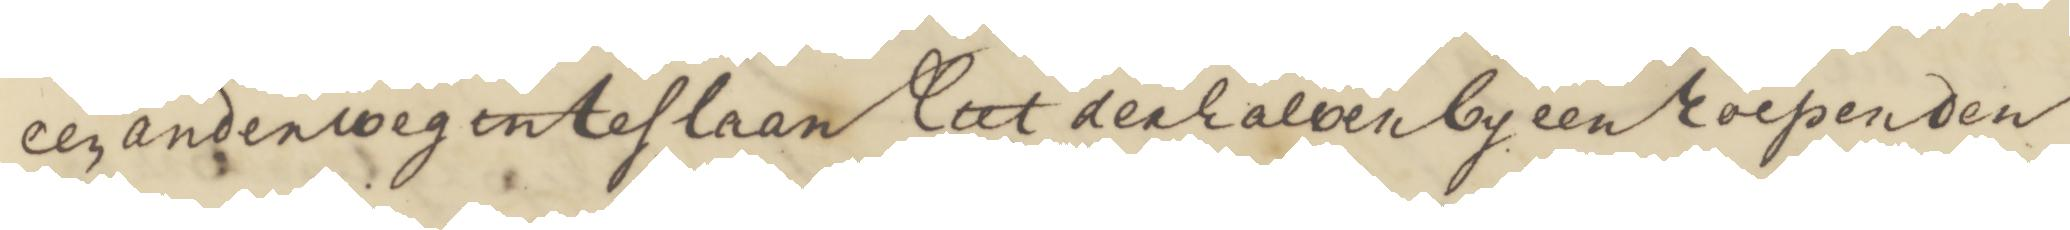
een ander weg inteslaan liet derhalven by een roepen den
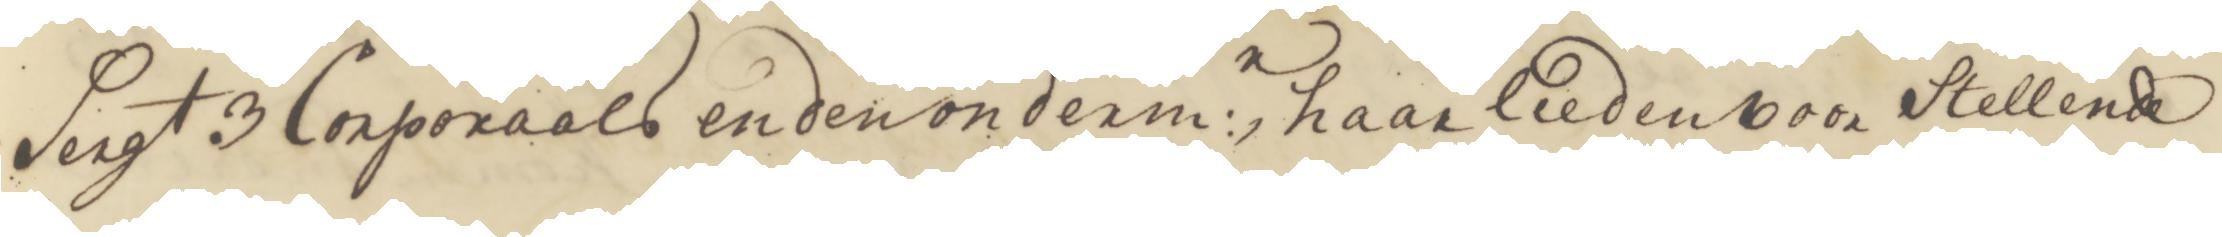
Serg.t 3 Corporaals en den onderm:r, haar lieden voor stellende
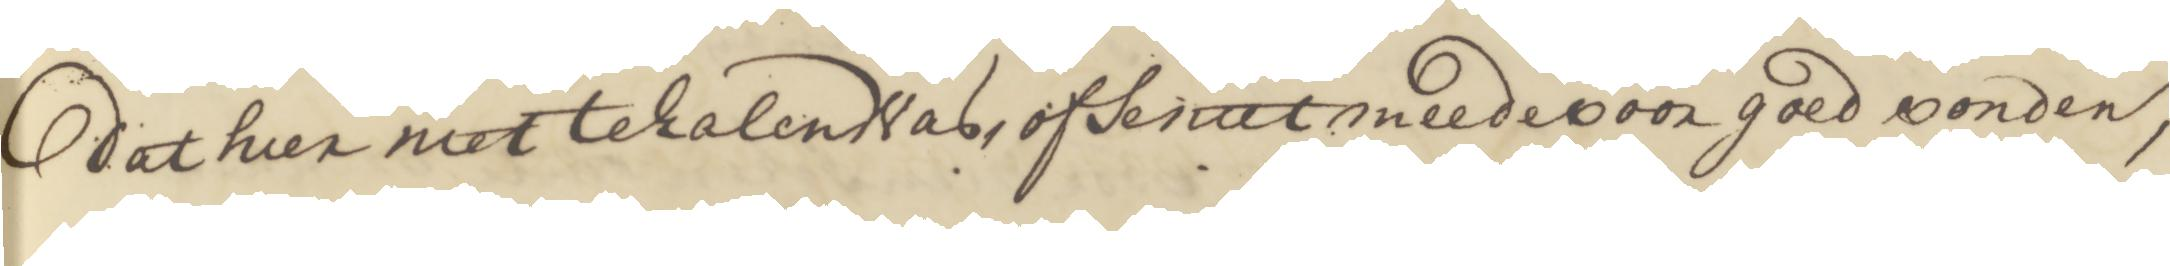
dat hier niet tehalen was, ofse niet meede voor goed vonden,
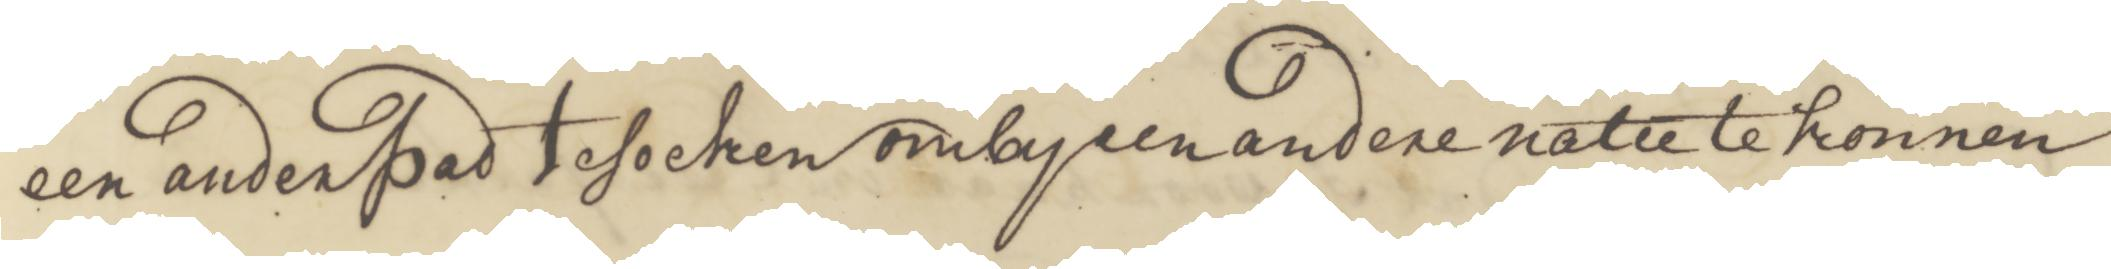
een ander pad tesoeken om by een andere natie te konnen
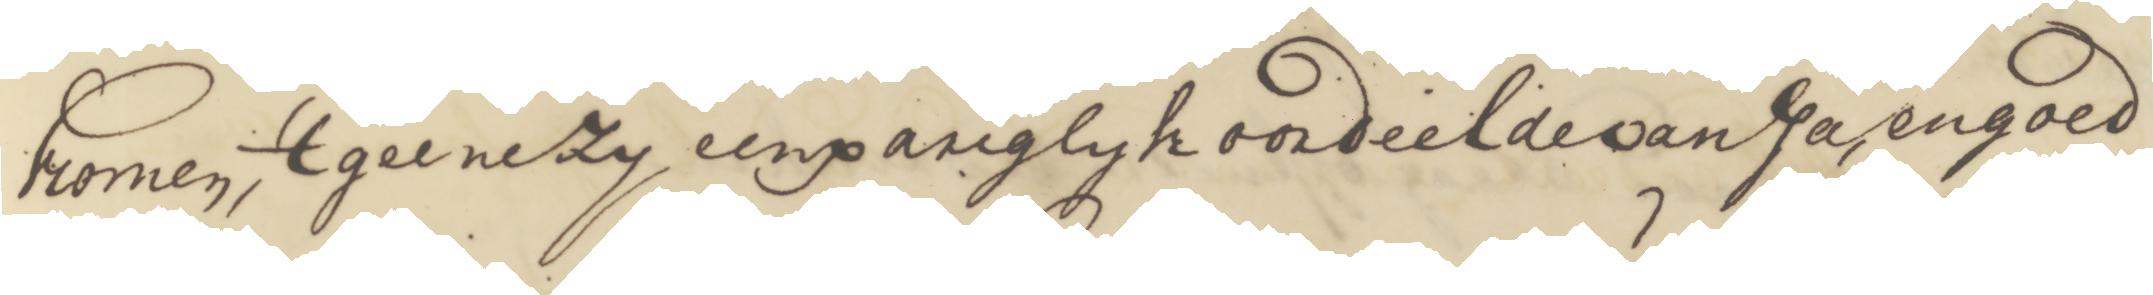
komen, ’t geene zy eenpariglyk oordeelde van Ja, en goed
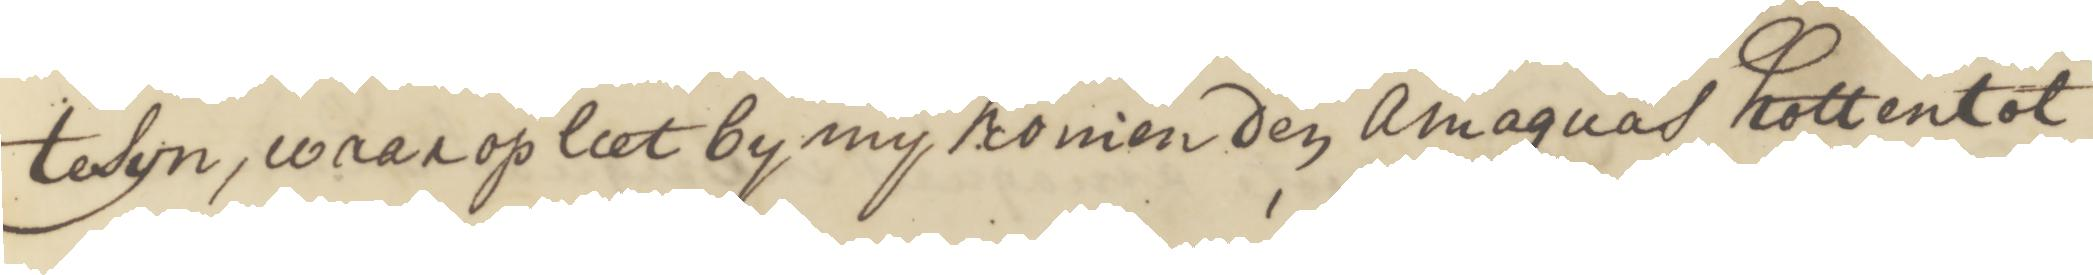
te syn, waar op liet by my komen den amaquas hottentot
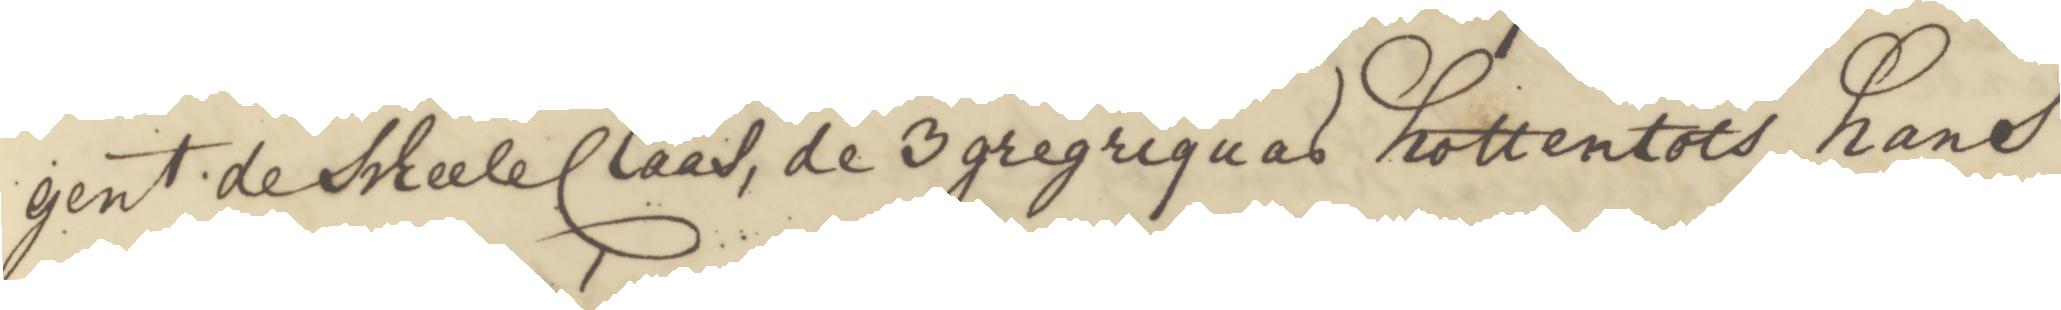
gent de scheele Claas, de 3 gregrequas hottentots hans
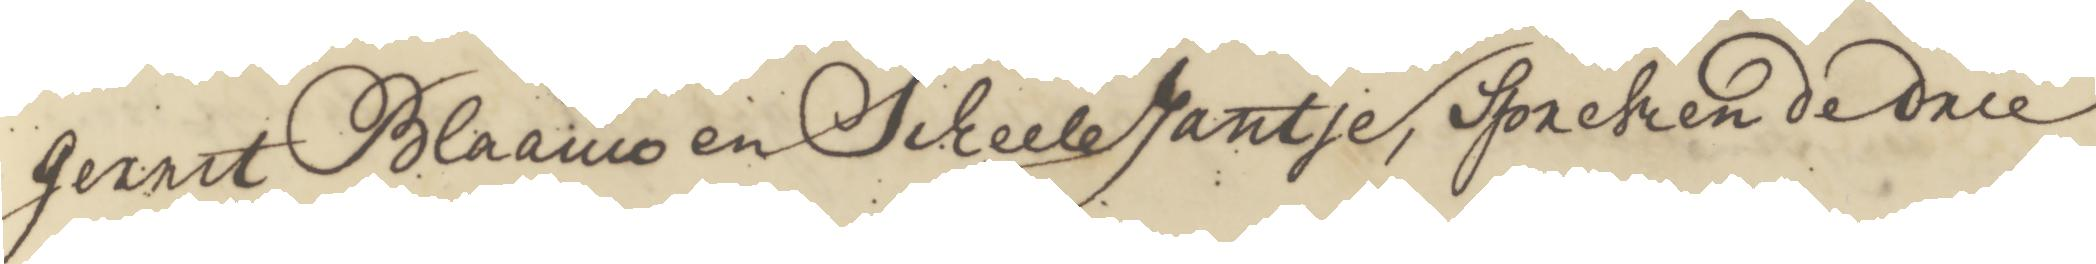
gerrit Blaauw en Scheele Jantje, spreken de drie
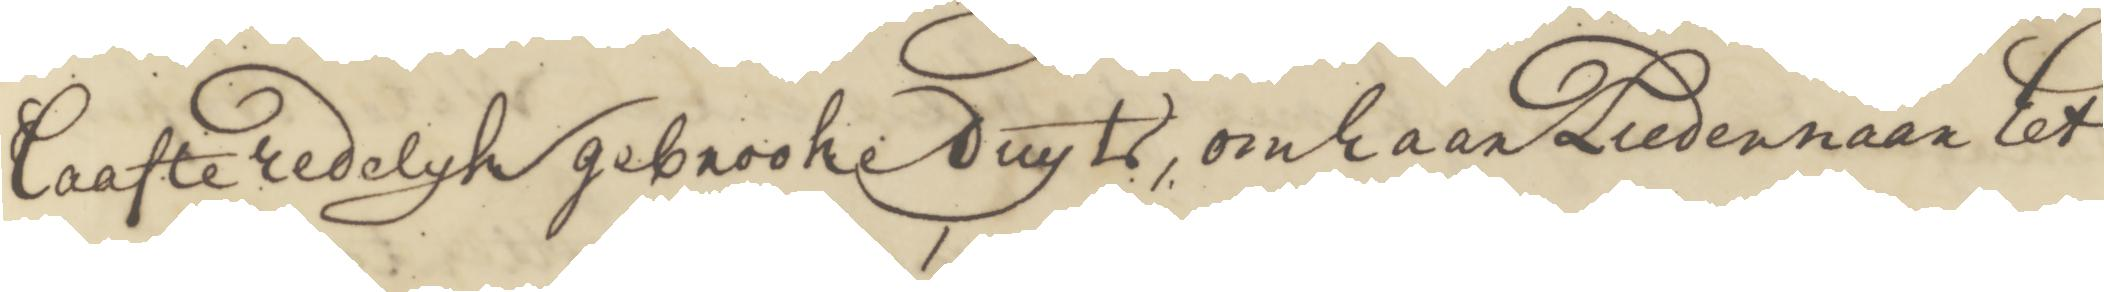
laaste redelyk gebrooke duyts, om haar Lieden naar het
